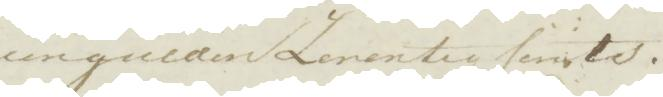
een gulden Zeventig Cents. . . . .
